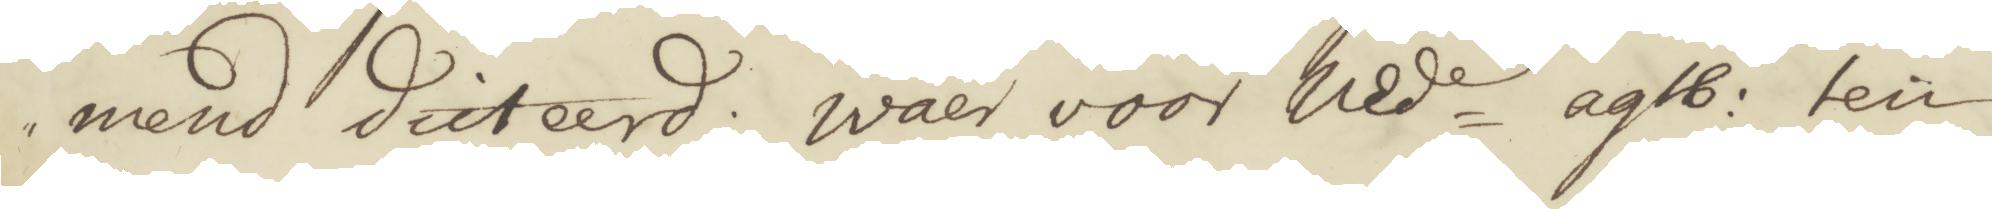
„mend dicteerd; waer voor UEd=e agtb: ten
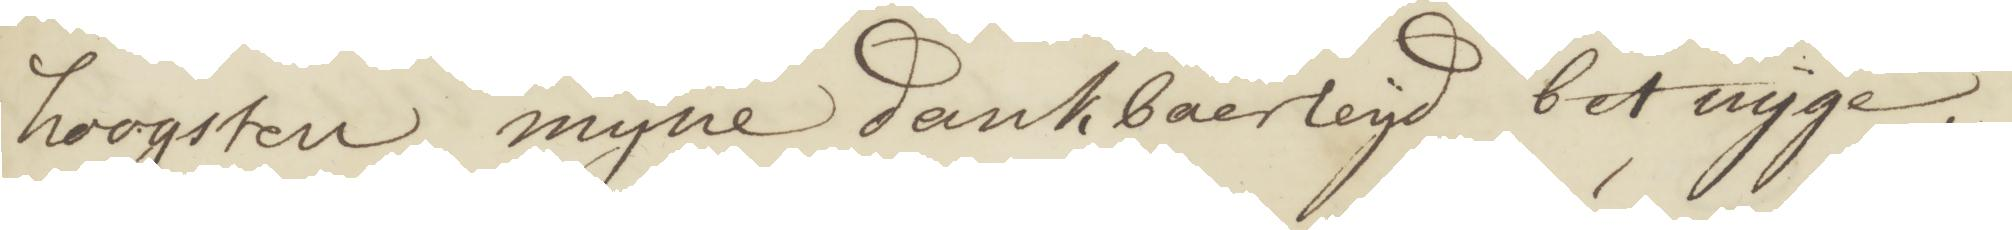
hoogsten mijne dankbaerheijd betuijge,
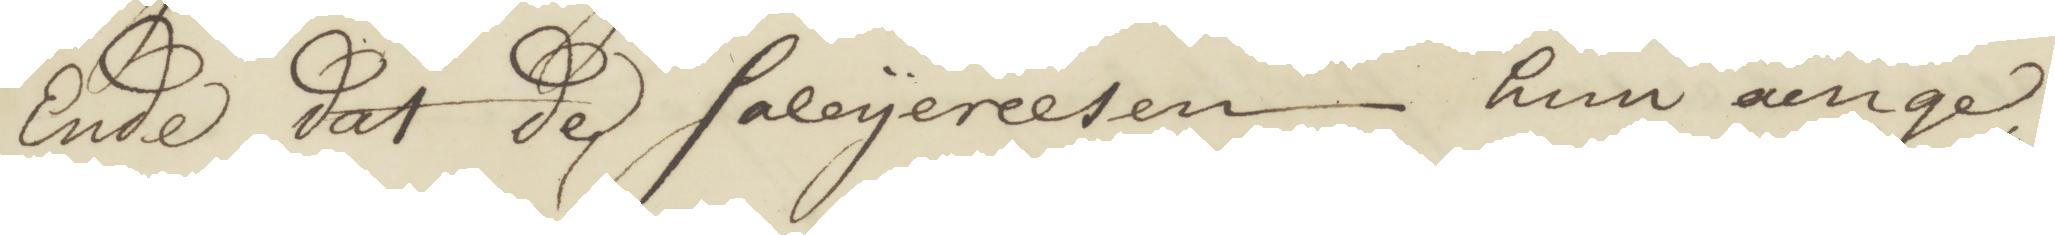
Ende dat de saleijereesen hun aenge„
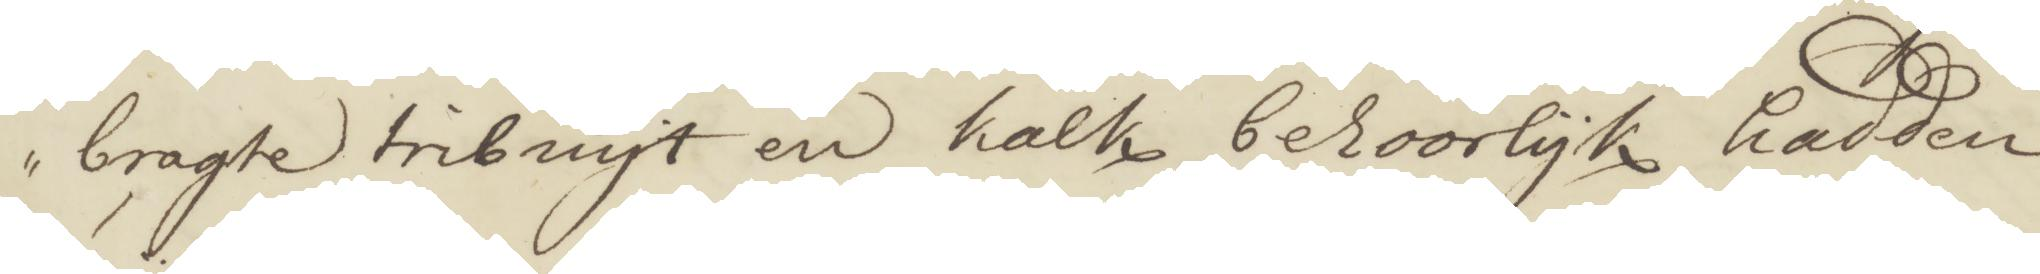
„bragte tribuijt en kalk behoorlijk hadden
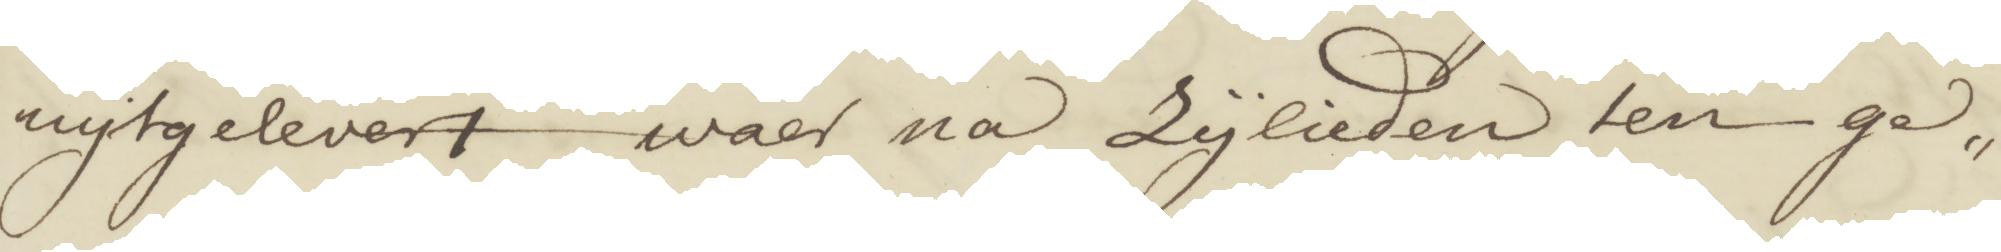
uijtgelevert waer na zijlieden ten ge„
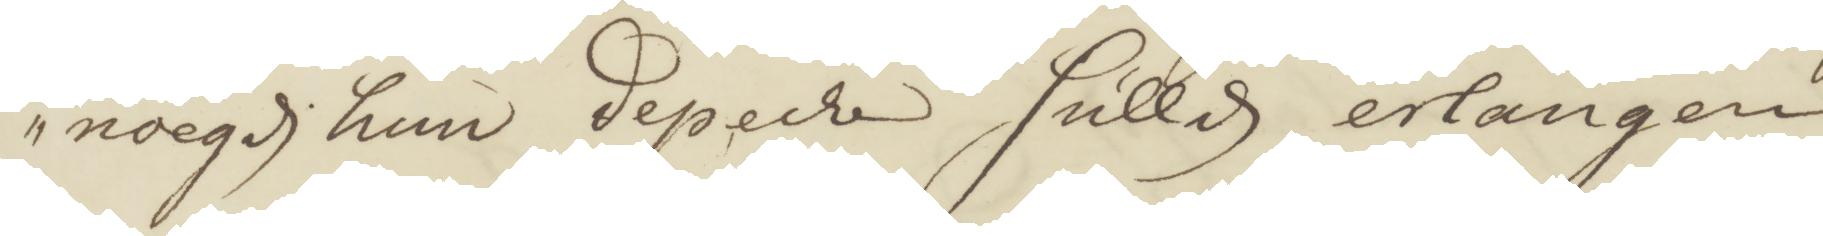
„noegen hun depeche sullen erlangen
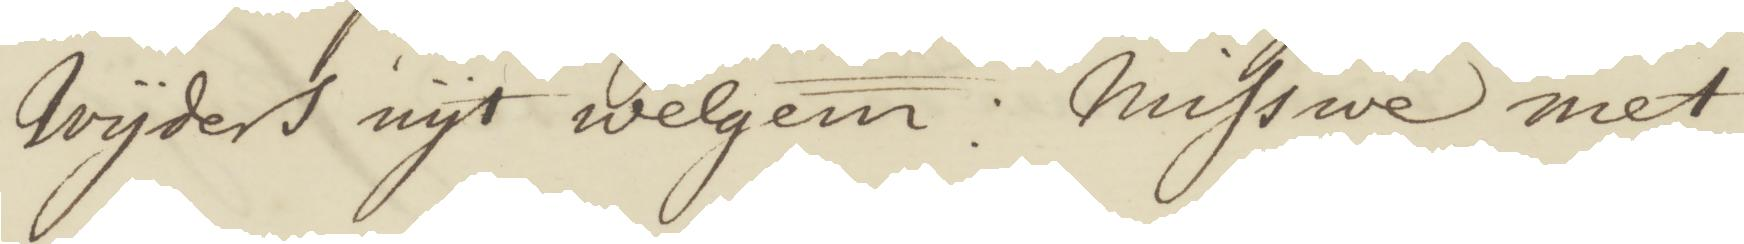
wijders uijt welgem: missive met
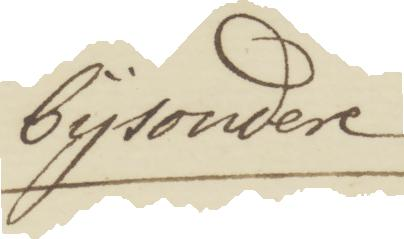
bijsondere
